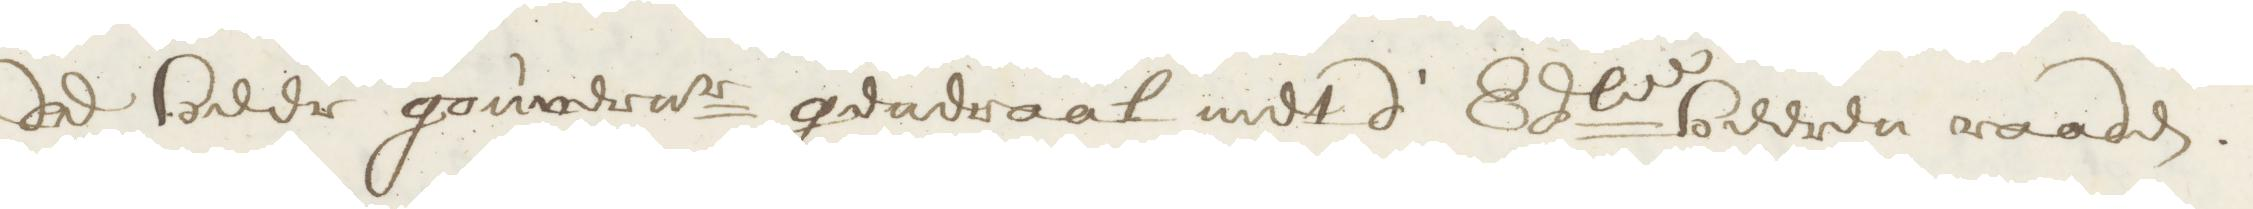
de heer gouvern=r generaal met d’ Ed=le heeren raaden.
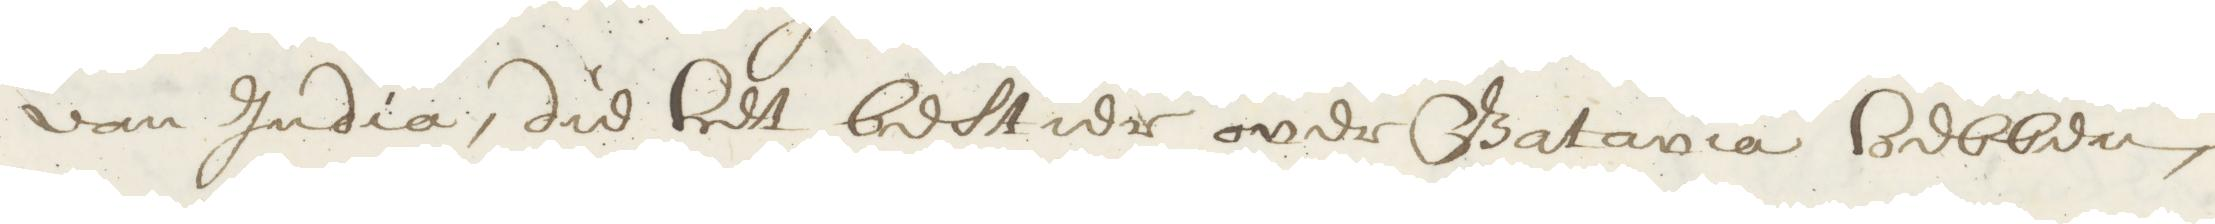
van Jndia, die het bestier over Batavia hebben,
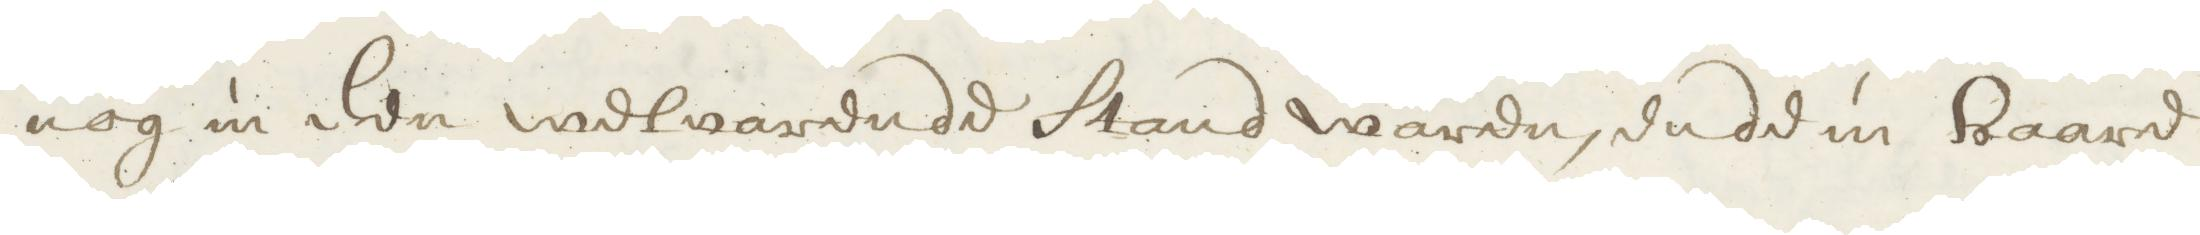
nog in Een welvarende stand waren, en de in haare
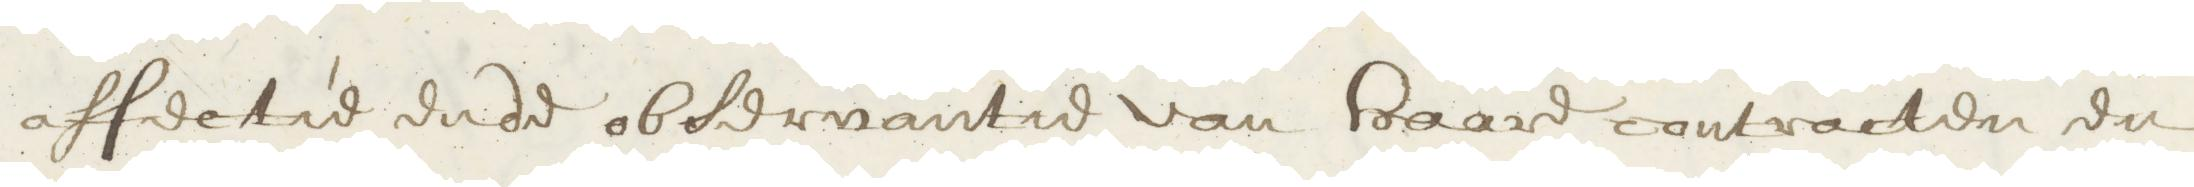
affectie ende observantie van haare contracten en
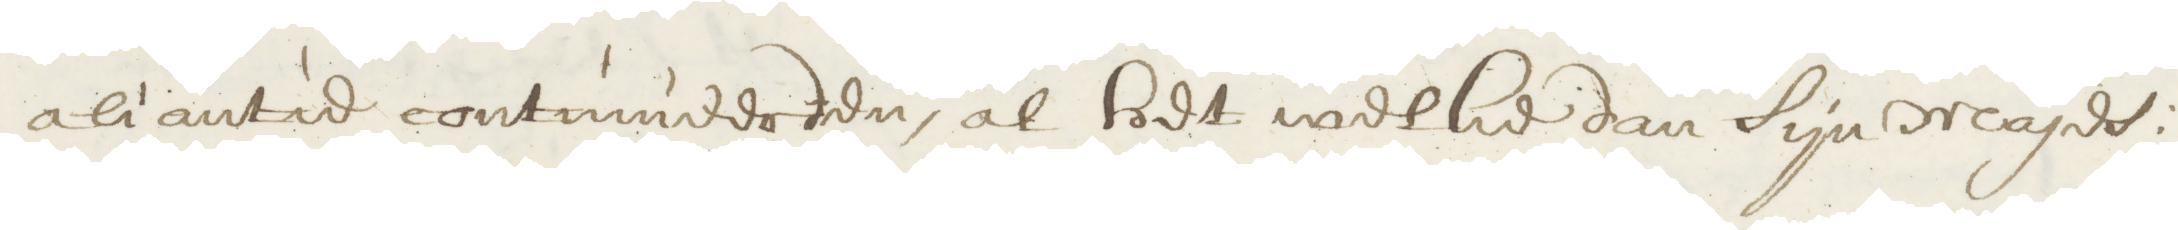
aliantie continueerden, al het welke dan sijn Majes:t
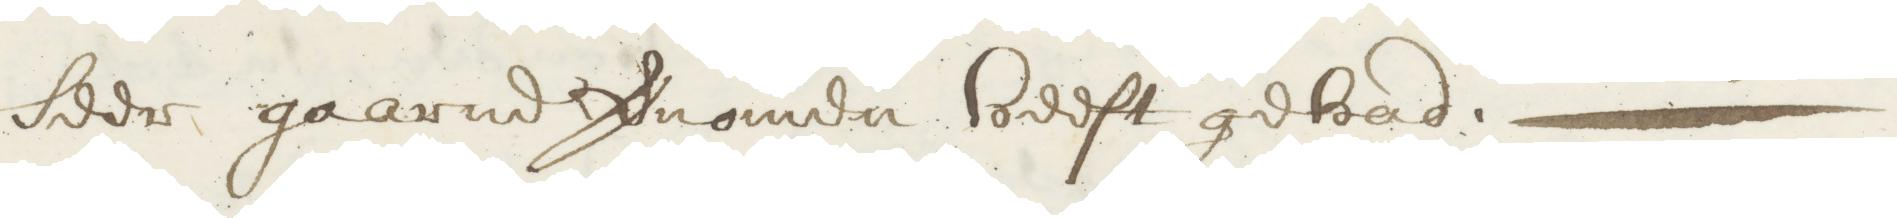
seer gaarne vernomen heeft gehad. —
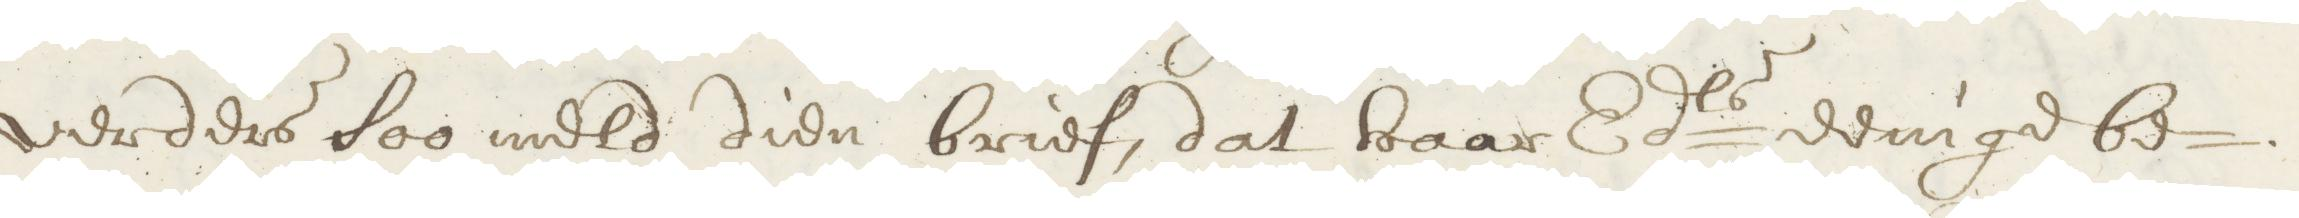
verders soo meld dien brief, dat haar Ed=ls eenige be=
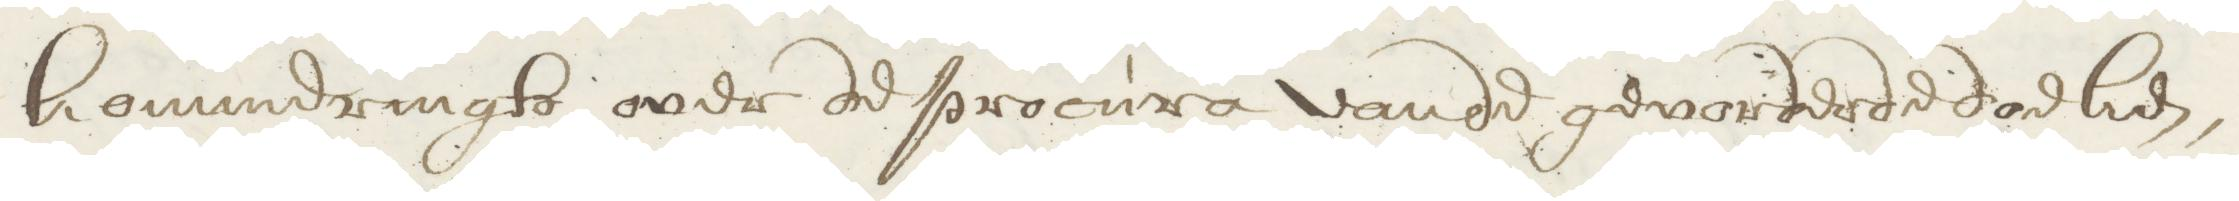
kommeringh over de procura vande gevorderde doeken,
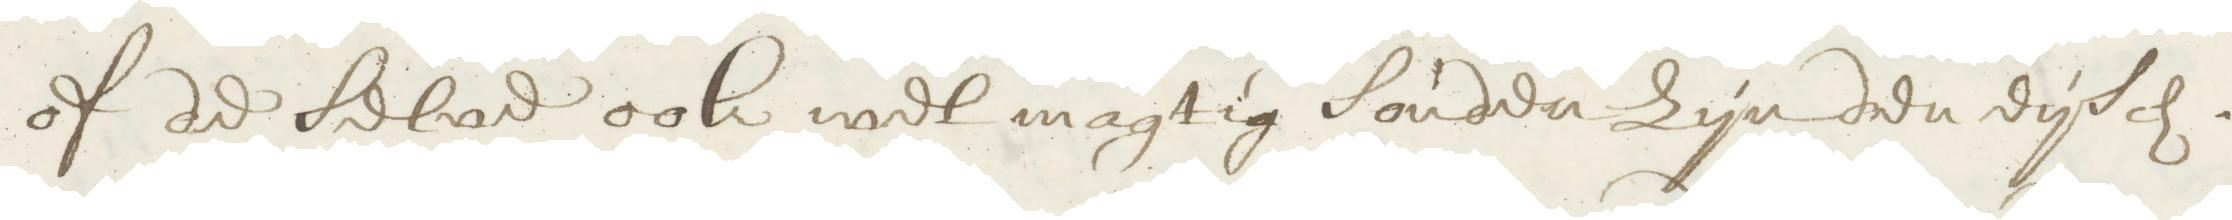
of de selve ook wel magtig souden zijn den eijsch
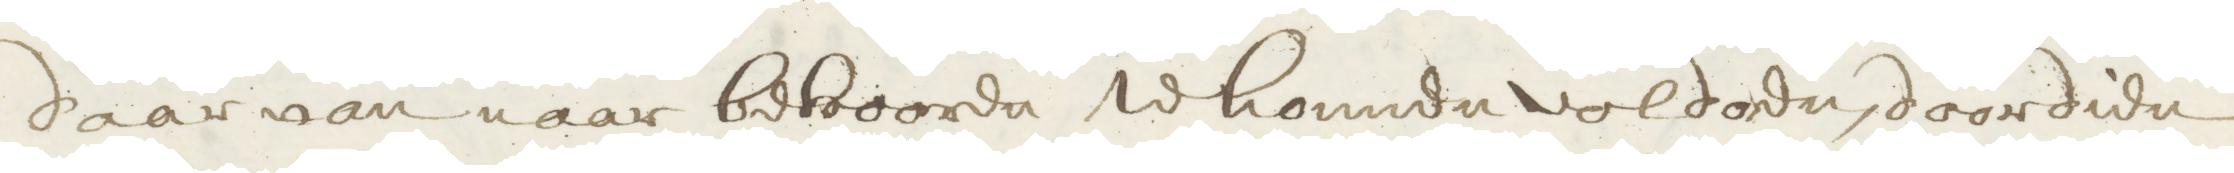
daar van naar behooren te konnen voldoen, door dien
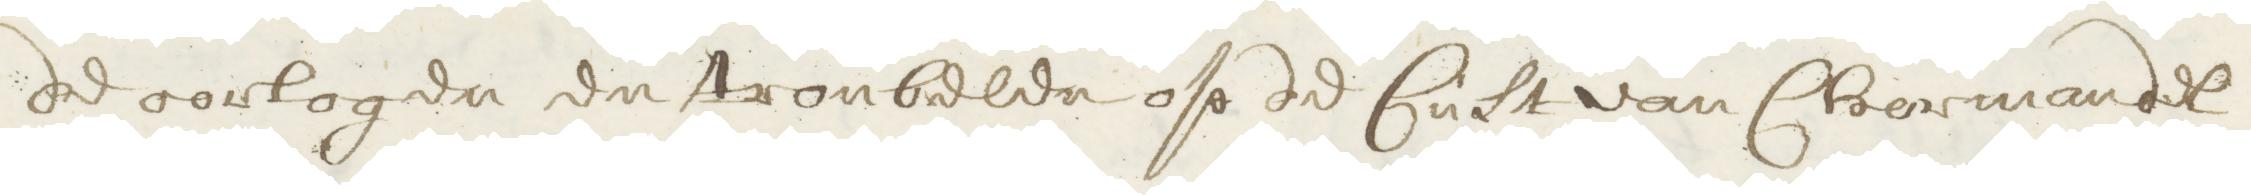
de oorlogen en troubelen op de Cust van Chormandel
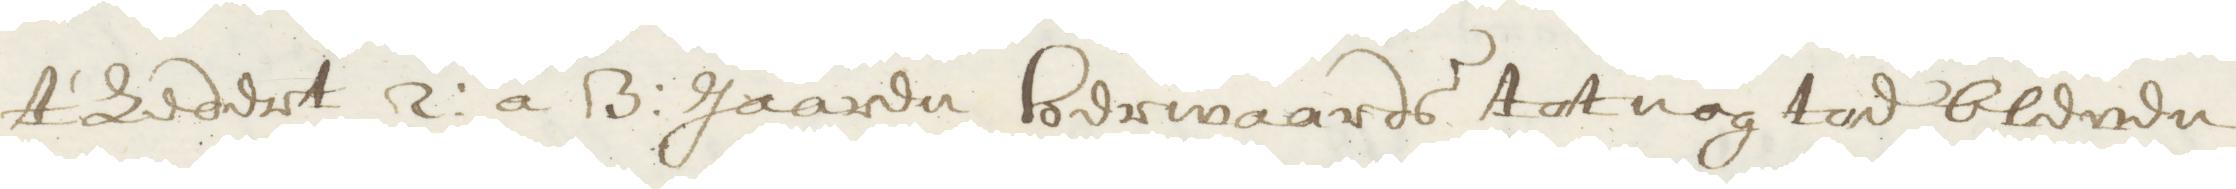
t' zedert 2: â 3: Jaaren herwaards tot nog toe bleven
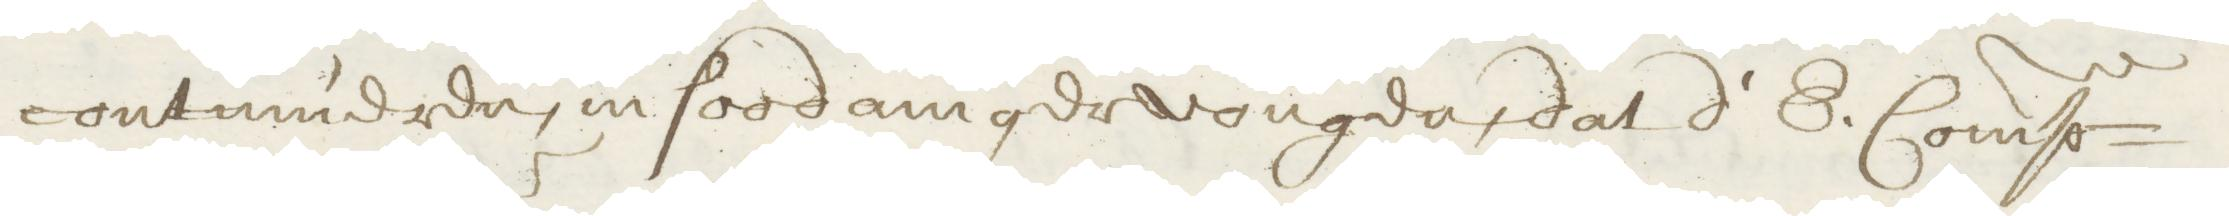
continueren, in soodaniger vougen, dat d’ E. Comp=e
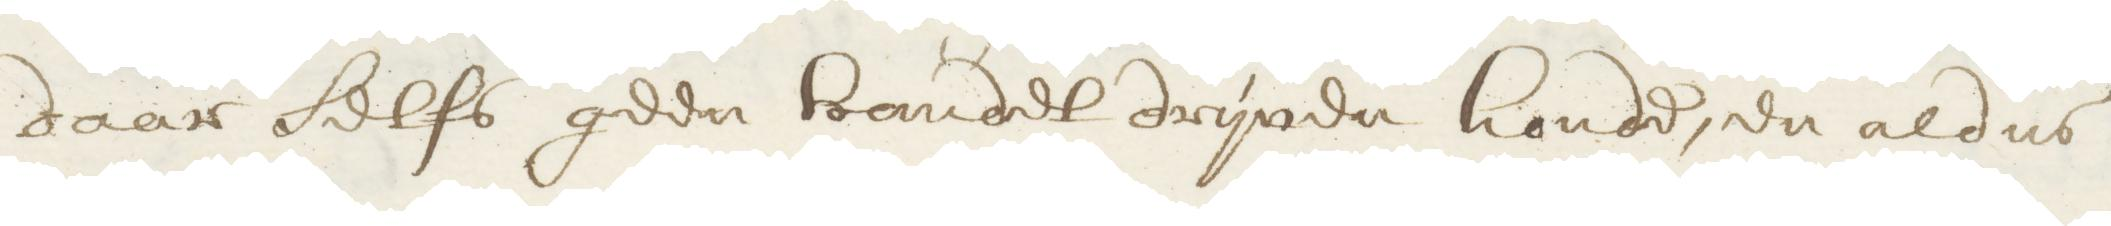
daar selfs geen handel drijven konde, en aldus
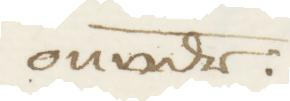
onver:
